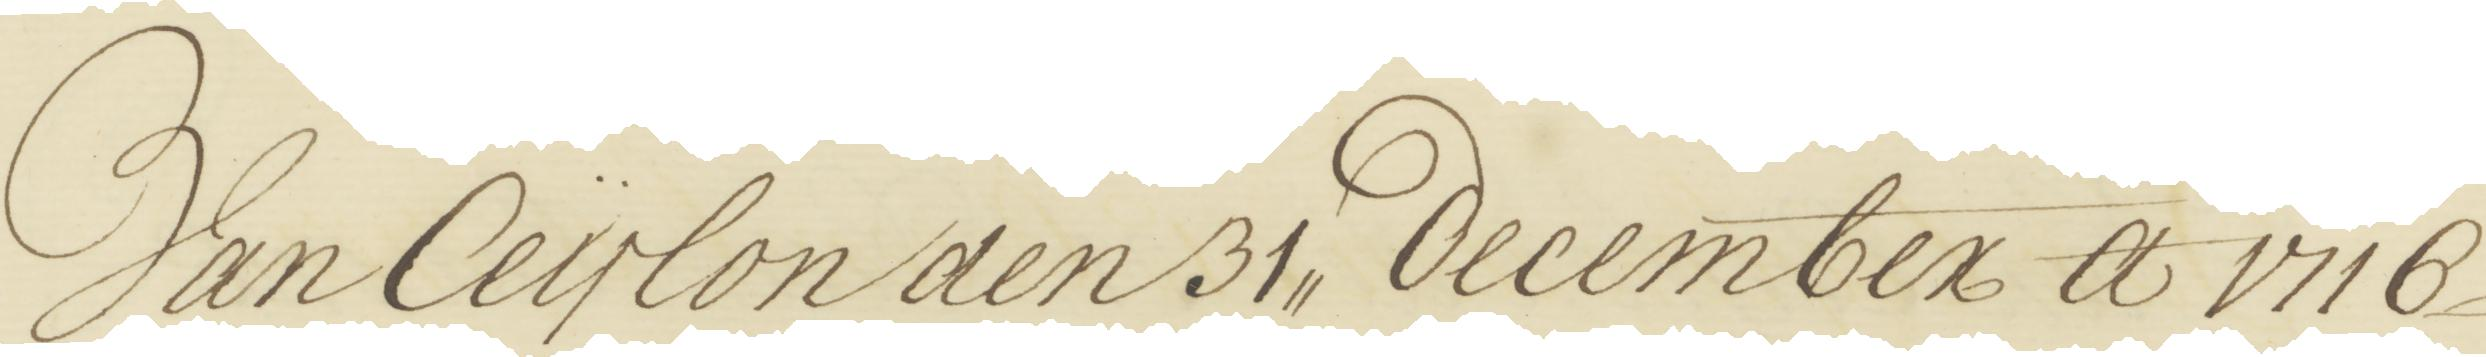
Van Ceijlon den 31„ december a 1716
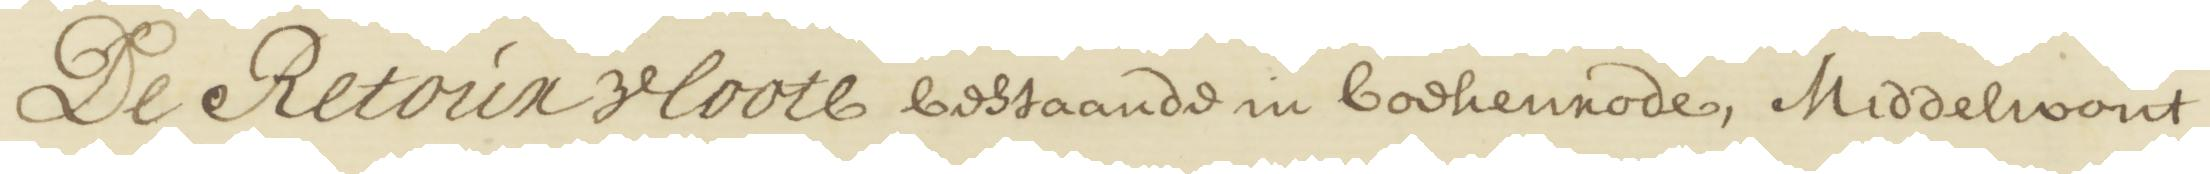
De Retour vloote bestaande in boekenrode, Middelwout
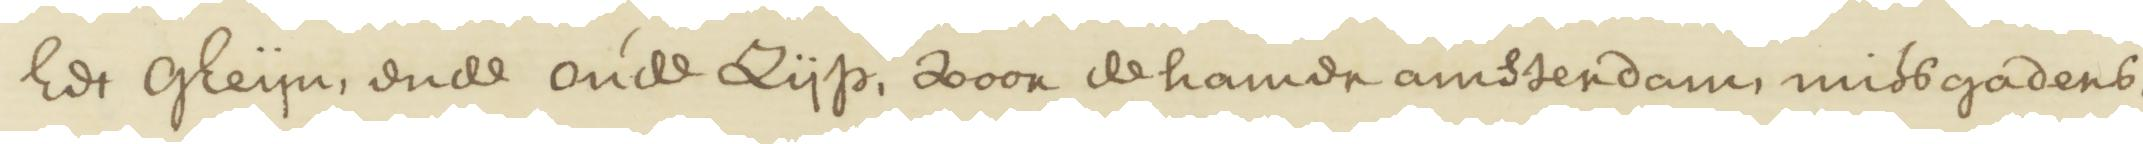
het Gheijn, ende oude Zijp, voor de kamer amsterdam, mitsgaders
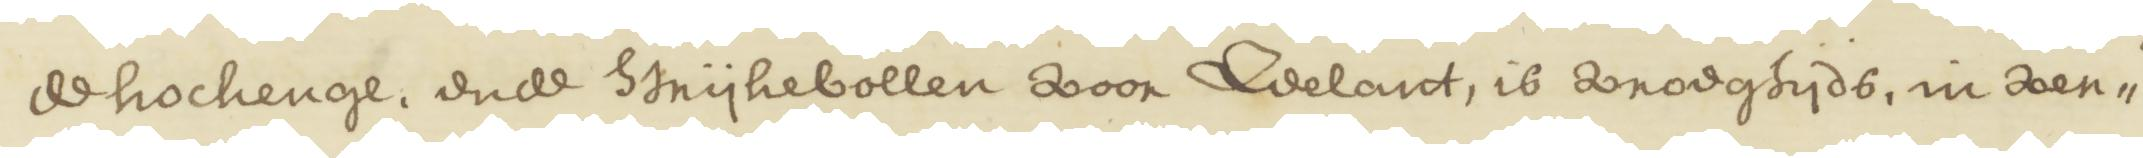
de kockenge, ende strijkebollen voor Zeelant, is vroegtijds, in ver„
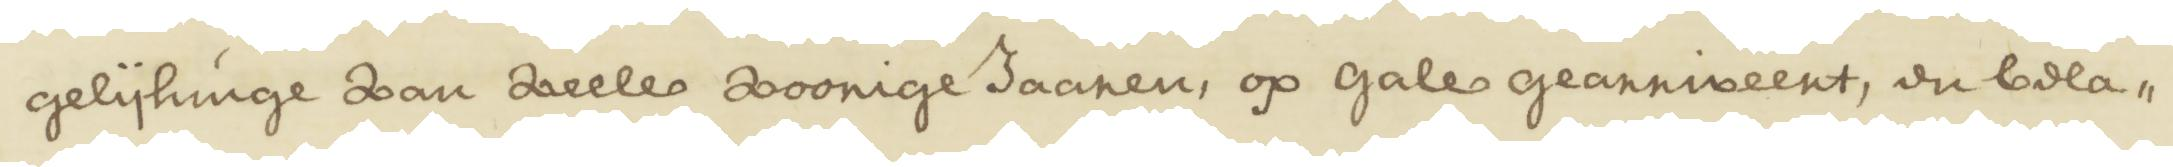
gelijkinge van veele voorige Iaaren, op gale gearriveert, en bela„
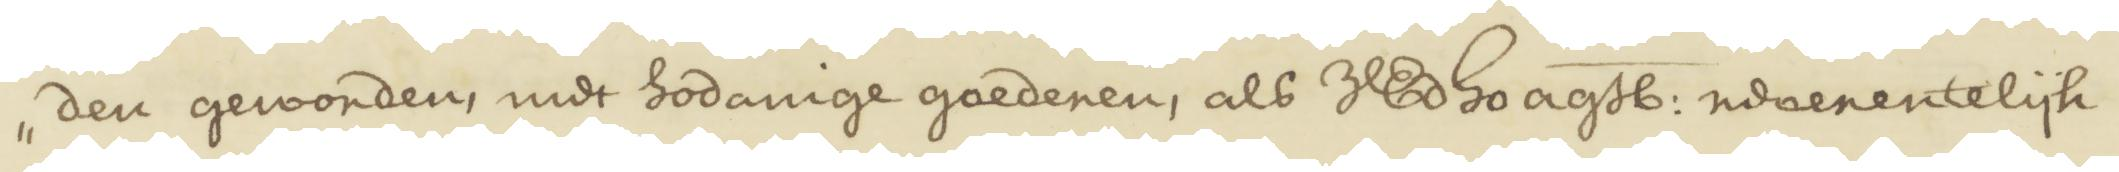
„den geworden, met sodanige goederen, als VEd ho agtb: reverentelijk
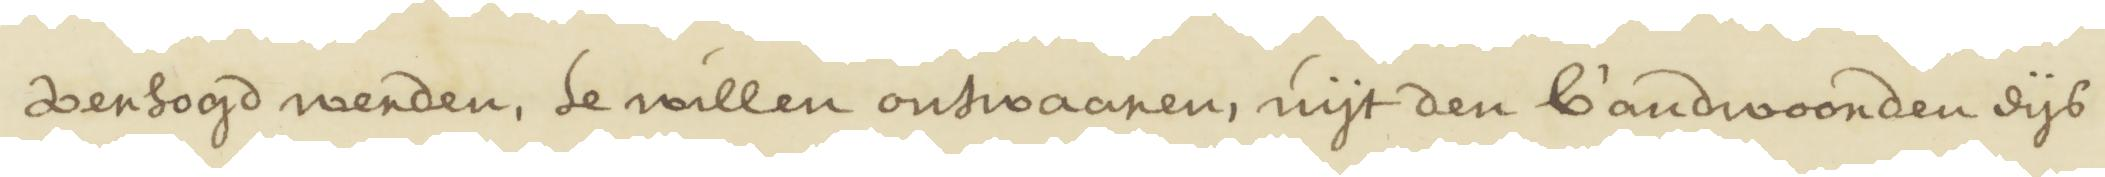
versogd werden, te willen ontwaaren, uijt den b'andwoorden eijs
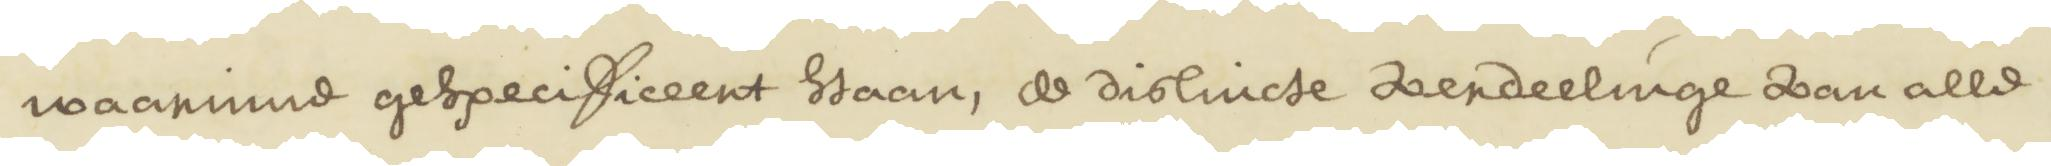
waarinne gespecificeert staan, de distincte verdeelinge van alle
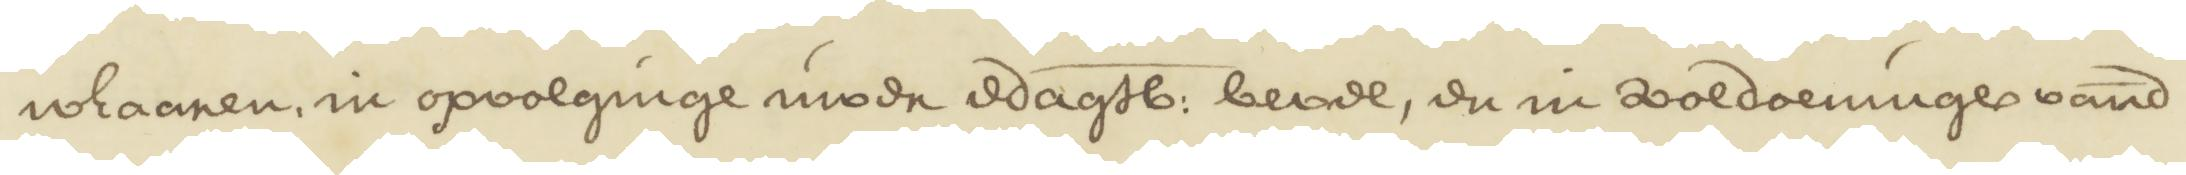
whaaren, in opvolginge uwer ed agtb: bevel, en in voldoeninge vand
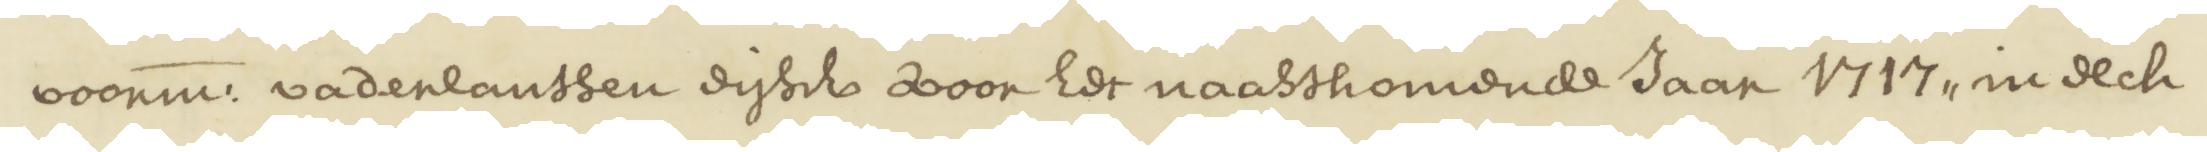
voorm: vaderlantsen eijsch voor het naastkomende Iaar 1717„ in elck
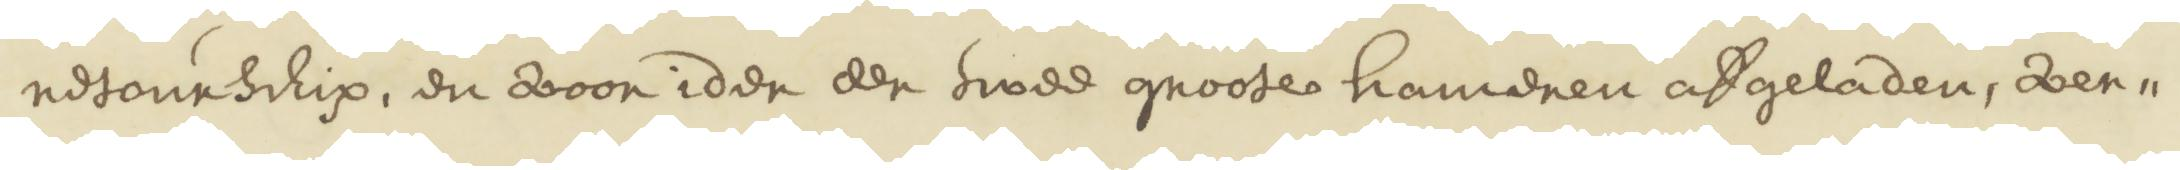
retourschip, en voor ider der twee groote kameren afgeladen, ver„
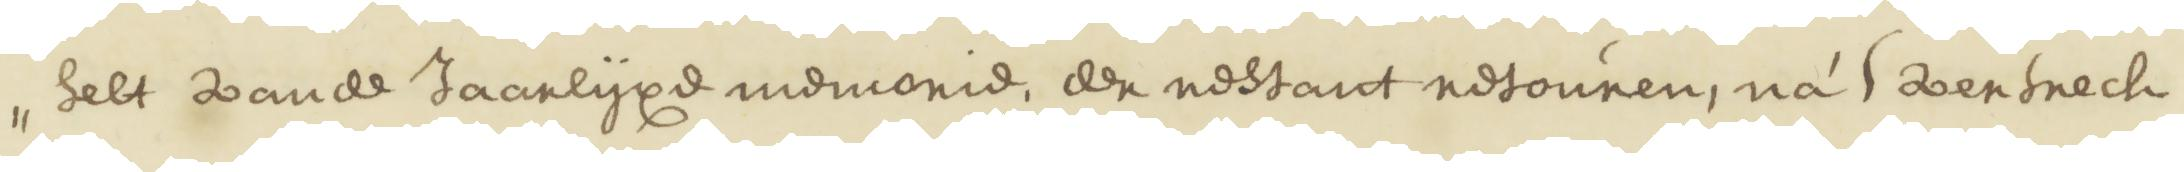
„selt van de Iaarlijxe memorie, der restant retouren, na 't vertreck
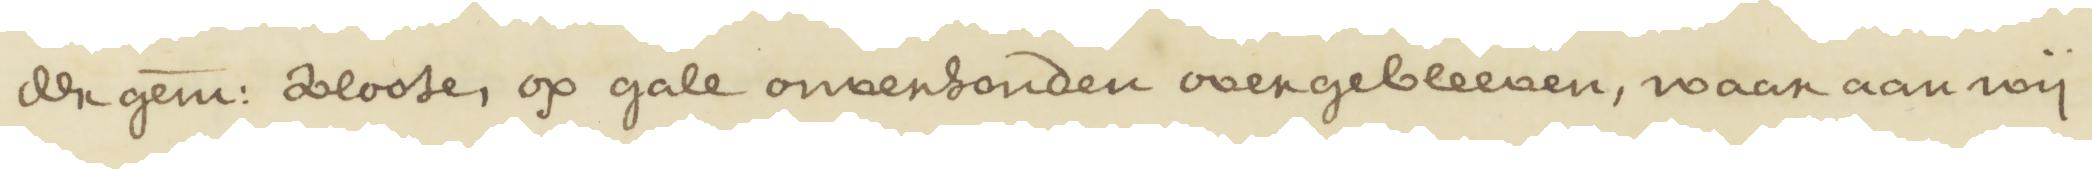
der gem: vloote, op gale onversonden overgebleeven, waar aan wij
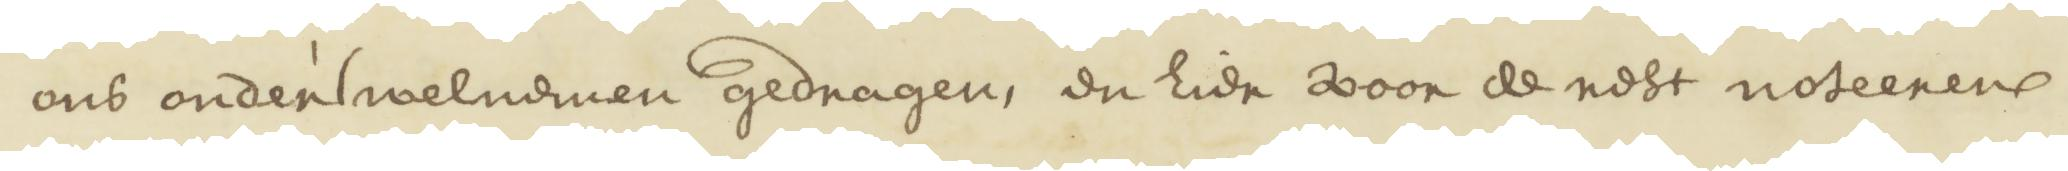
ons onder't welnemen gedragen, en hier voor de rest noteeren
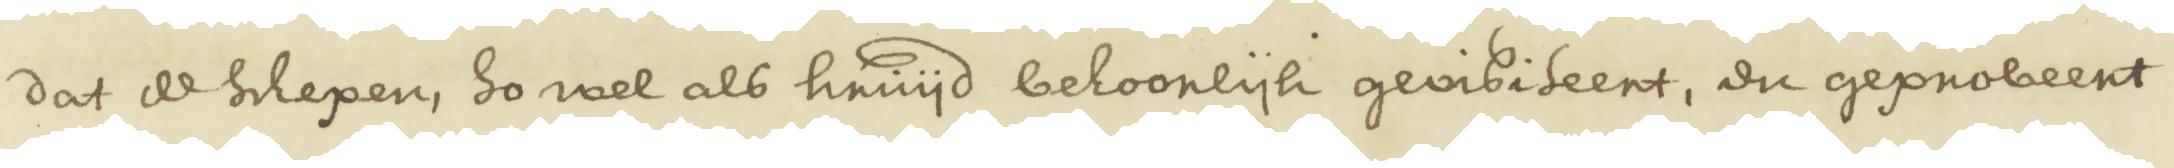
dat de schepen, so wel als kruijd behoorlijk gevisiteert, en geprobeert
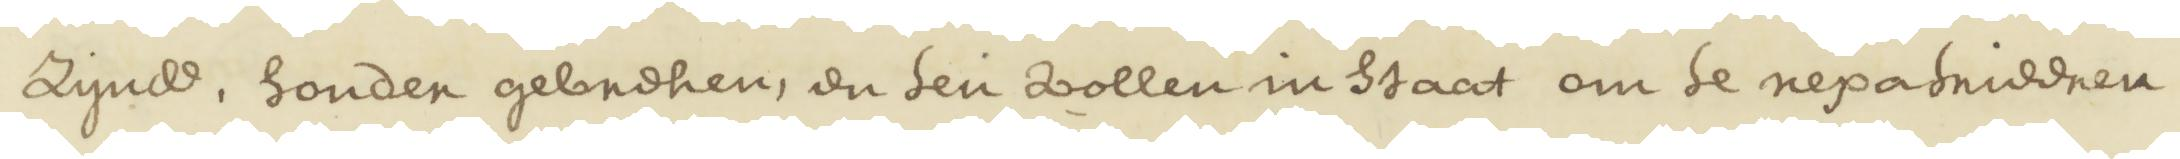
zijnde, sonder gebreken, en ten vollen in staat om te repatrieeren
